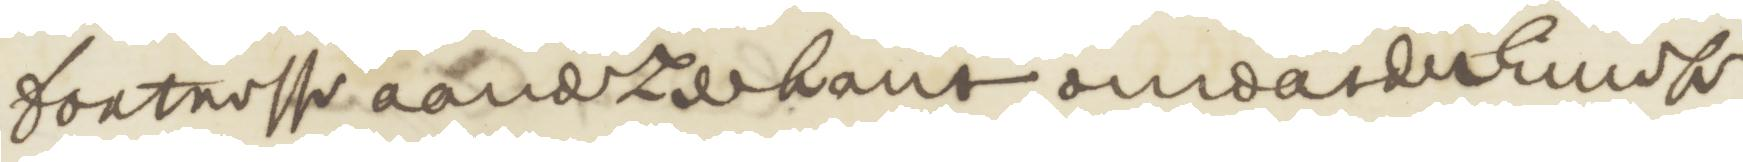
fortresse aan de zeekant omdat de chinese
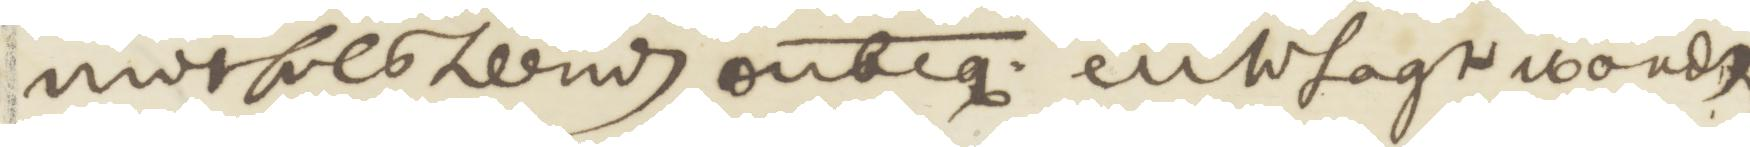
metselsteenen onbeq: en te sagt worden
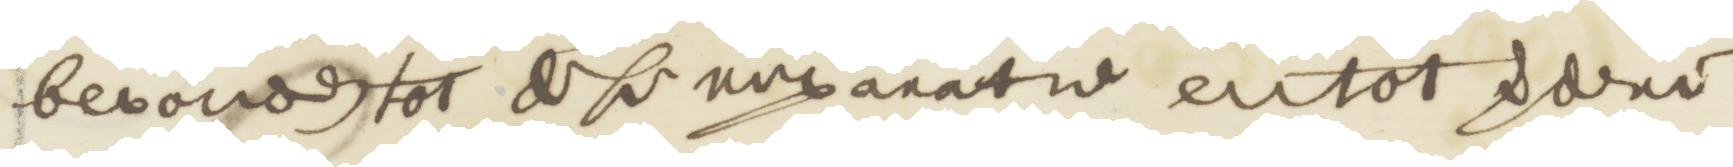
bevonden tot dese reparatie en tot verdere
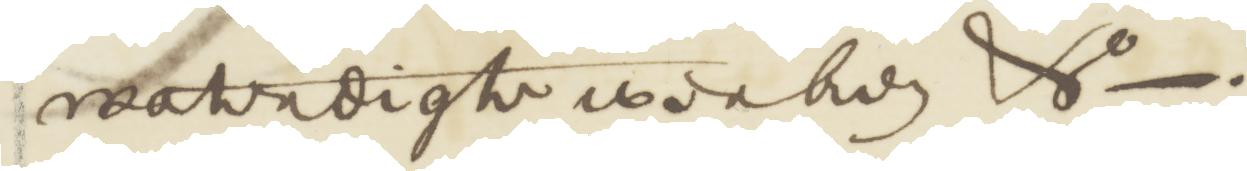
waterdigte werken d_o.
